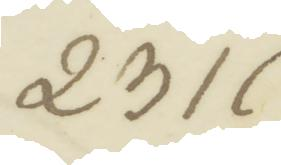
2315
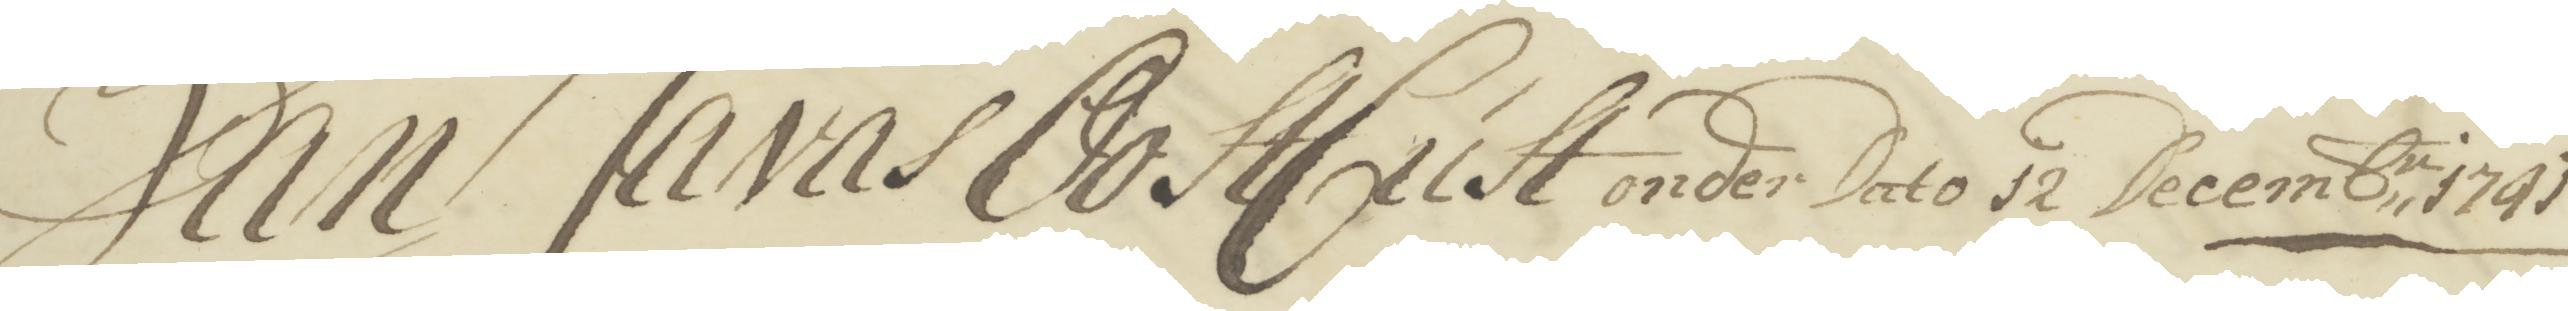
Van Javas Oost Cust onder dato 12 Decemb„r 1741
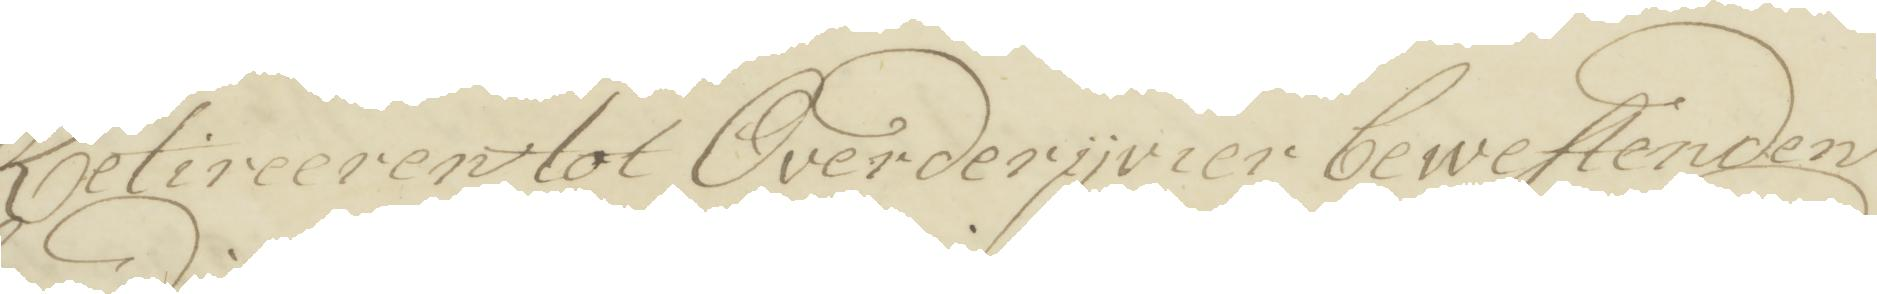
Retireeren tot Over de rijvier bewesten den
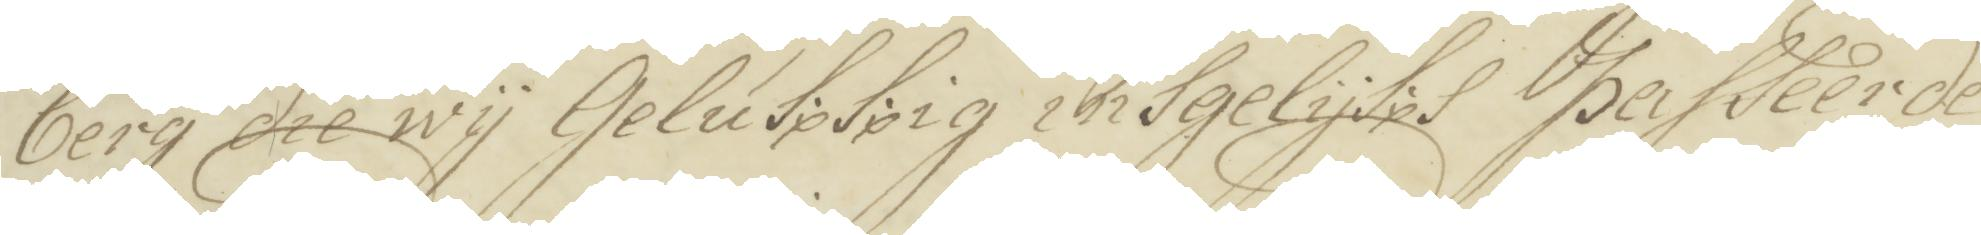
berg die wij gelukkig insgelijks passeerde
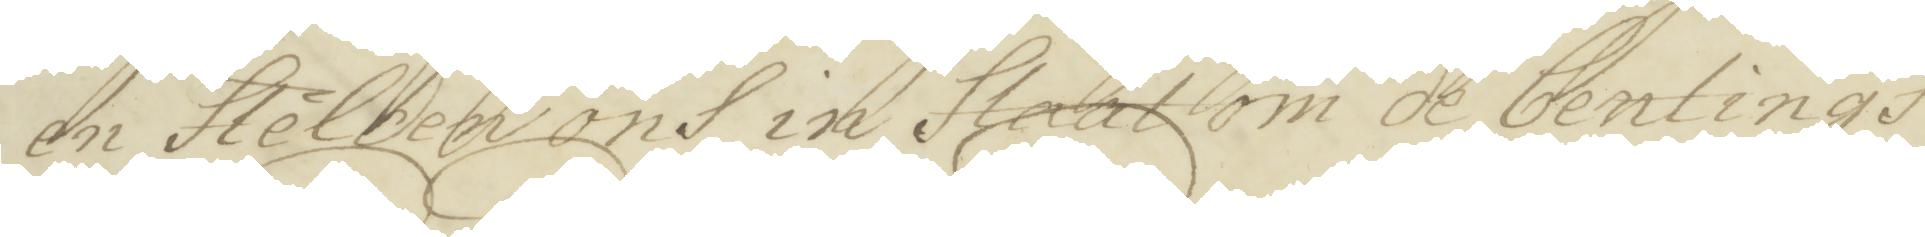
en stelden ons in staat om de bentings
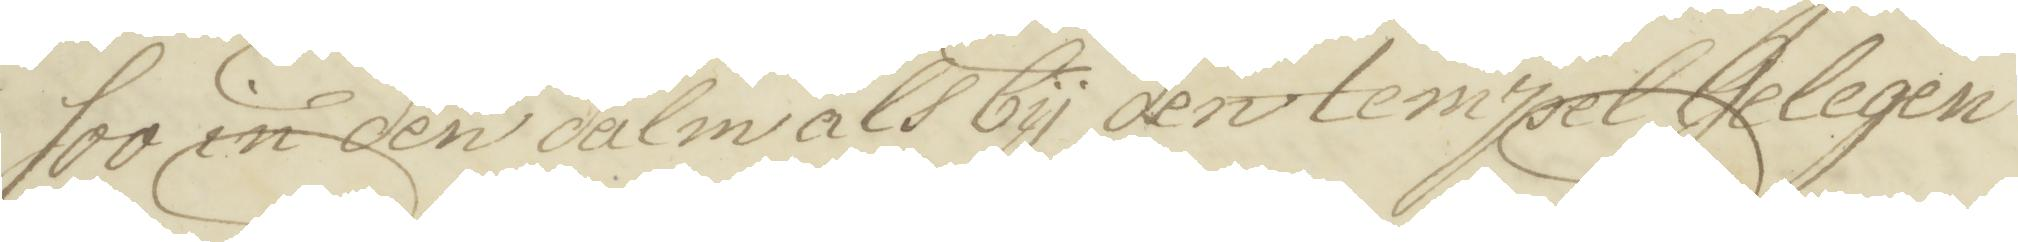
soo in den dalm als bij den tempel gelegen
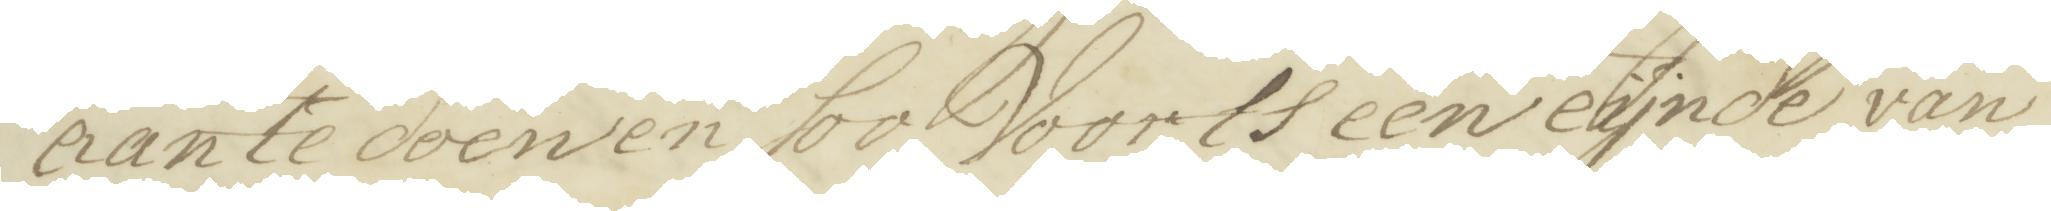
aan te doen en soo voorts een eijnde van
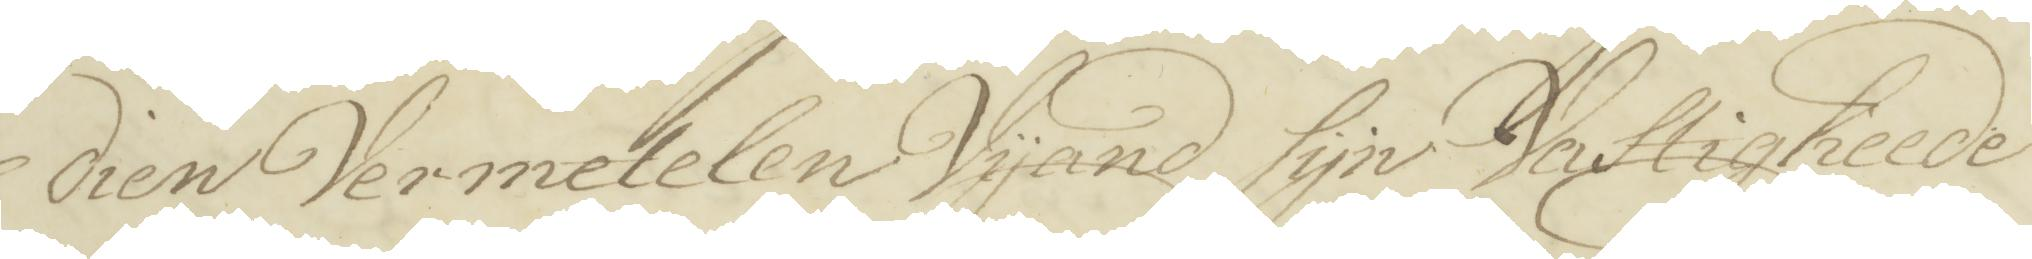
dien vermetelen vijand sijn vastigheede
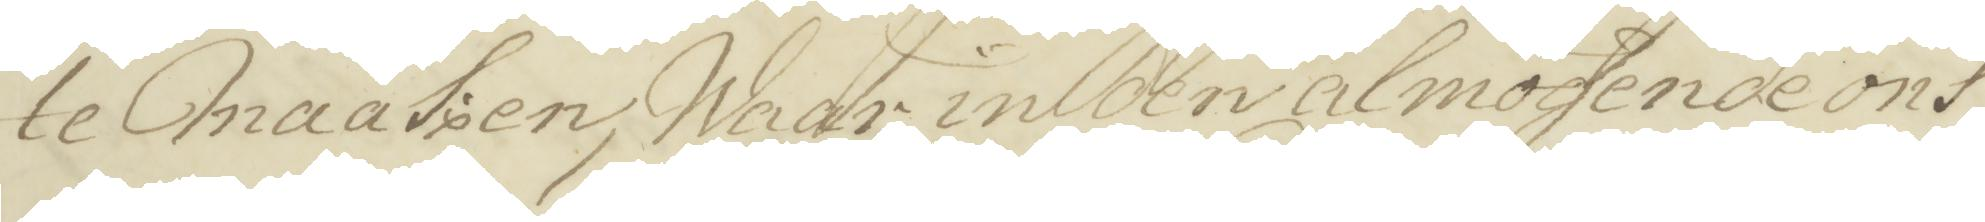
te maaken, waar in den almogende ons
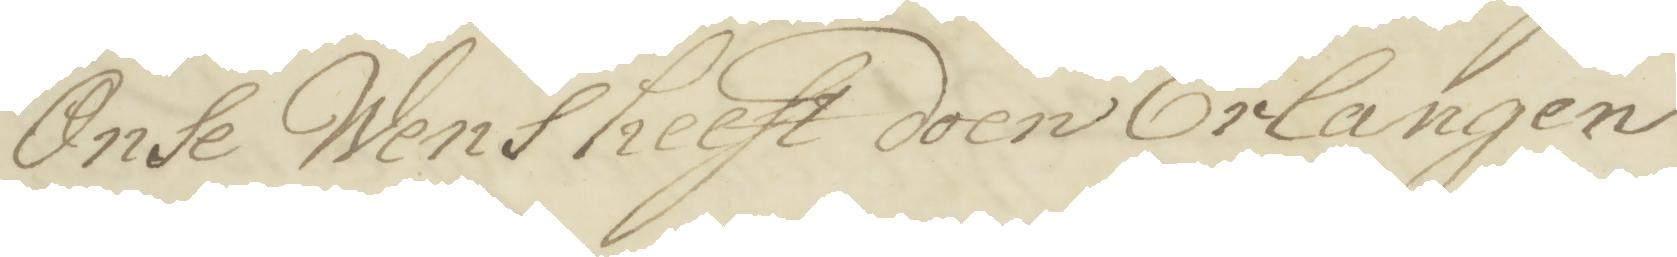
Onse wens heeft doen Erlangen
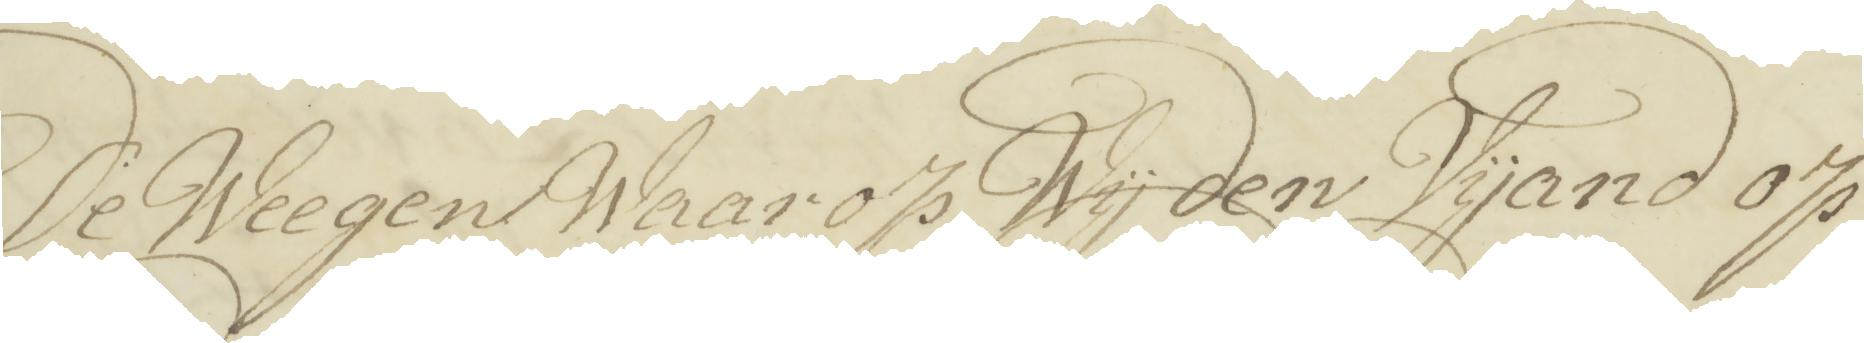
de weegen waar op wij den vijand op
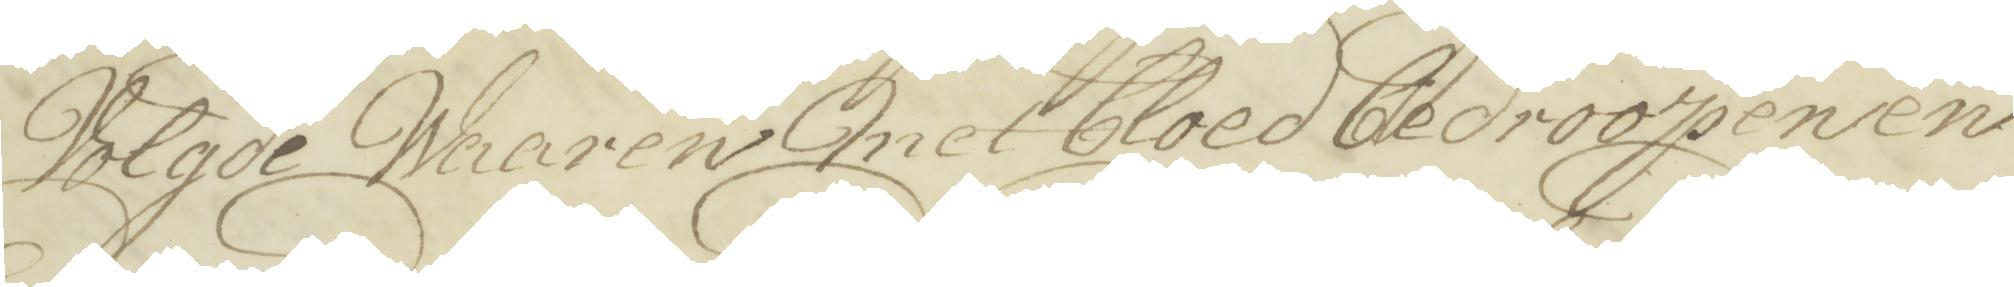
volgde waaren met bloed bedroopen en
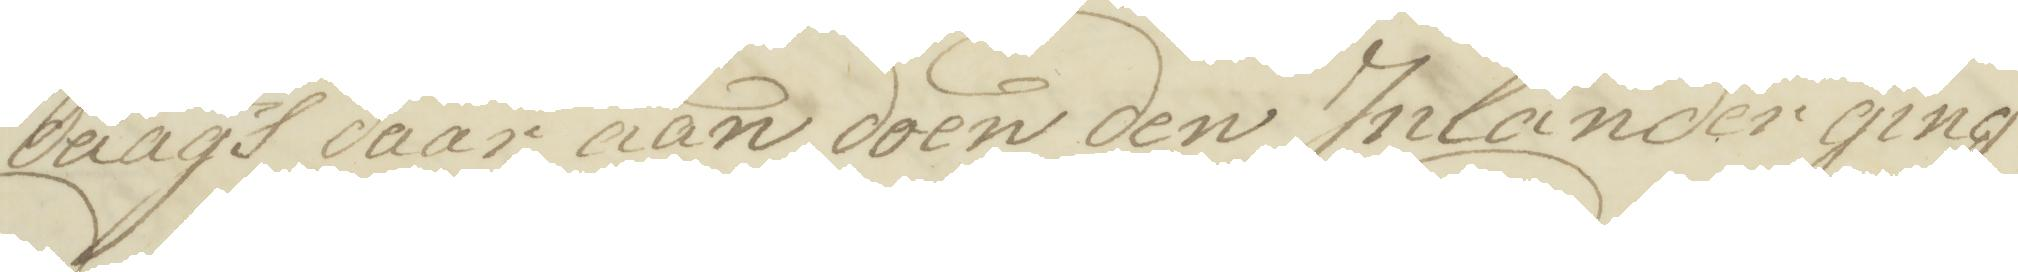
daags daar aan doen den Jnlander ging
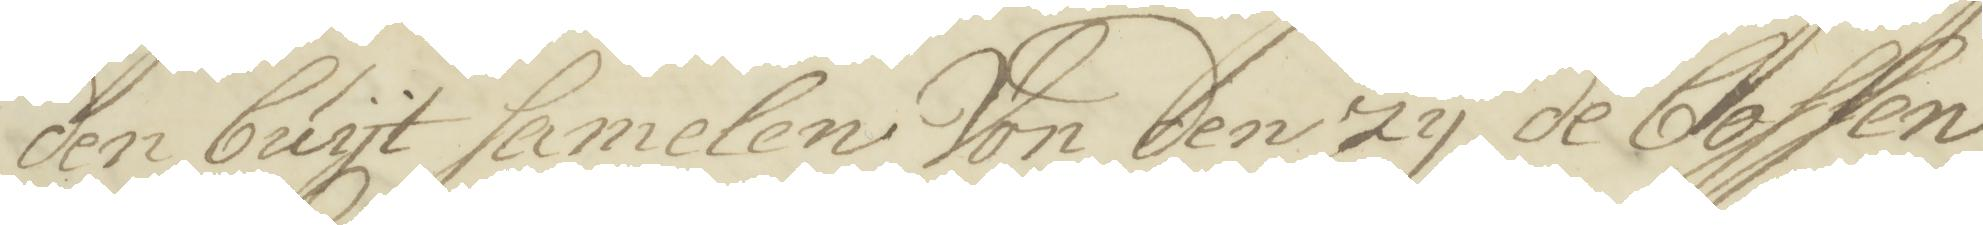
den buijt samelen van den zij de bossen
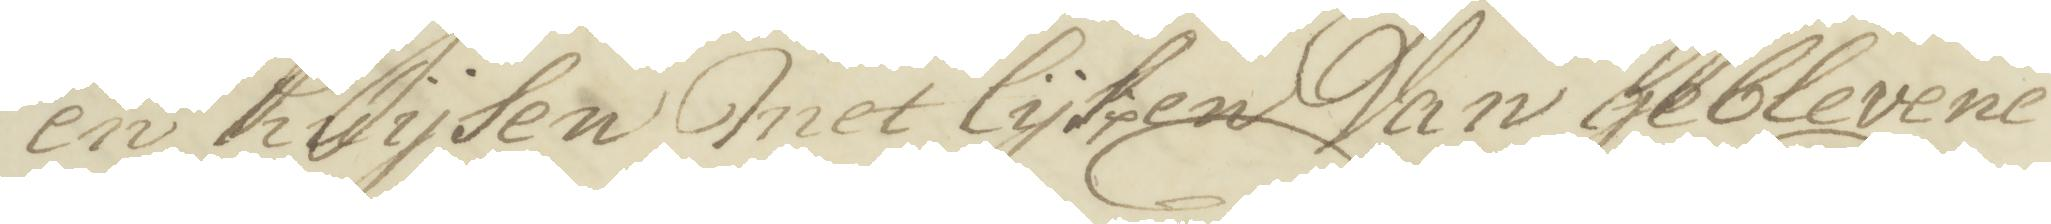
en huijsen met lijken van geblevene
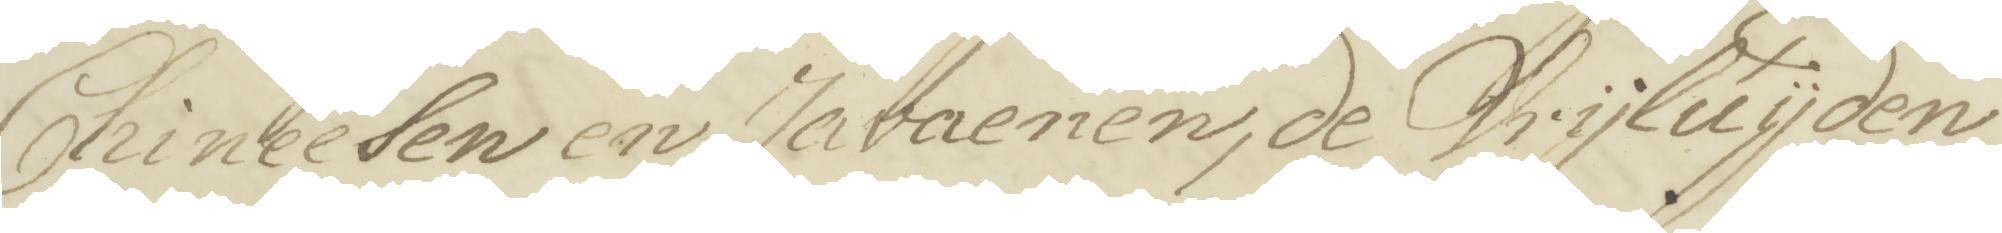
Chineesen en Javaenen, de vrijluijden
